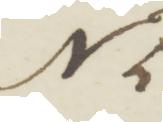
N 5
